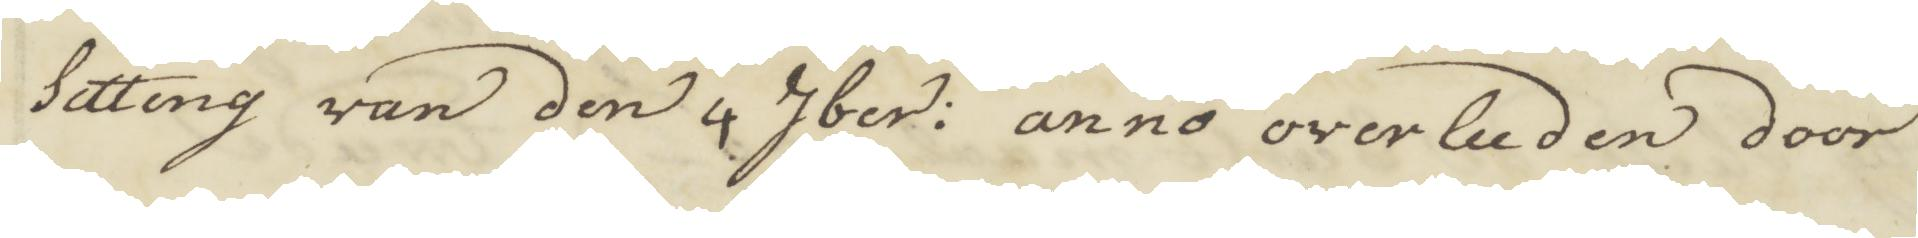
sitting van den 4 7ber: anno overleeden door
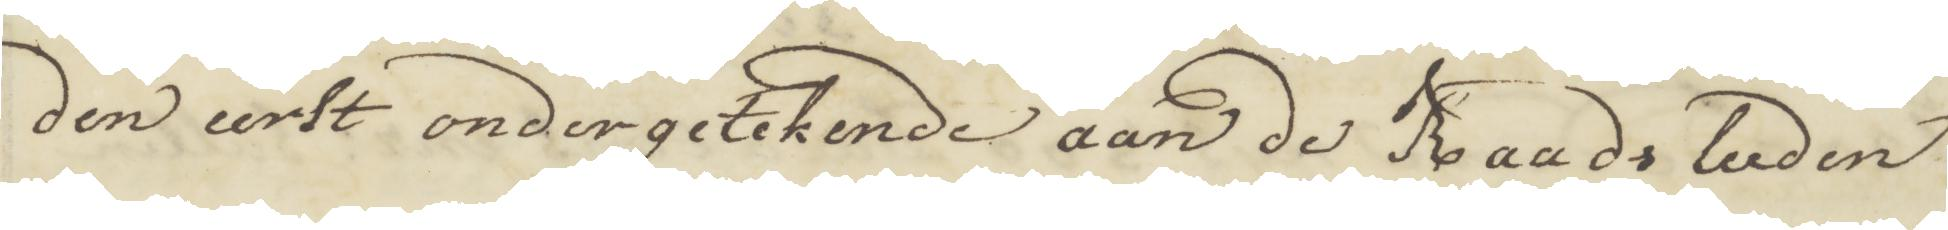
den eerst ondergetekende aan de Raads leeden
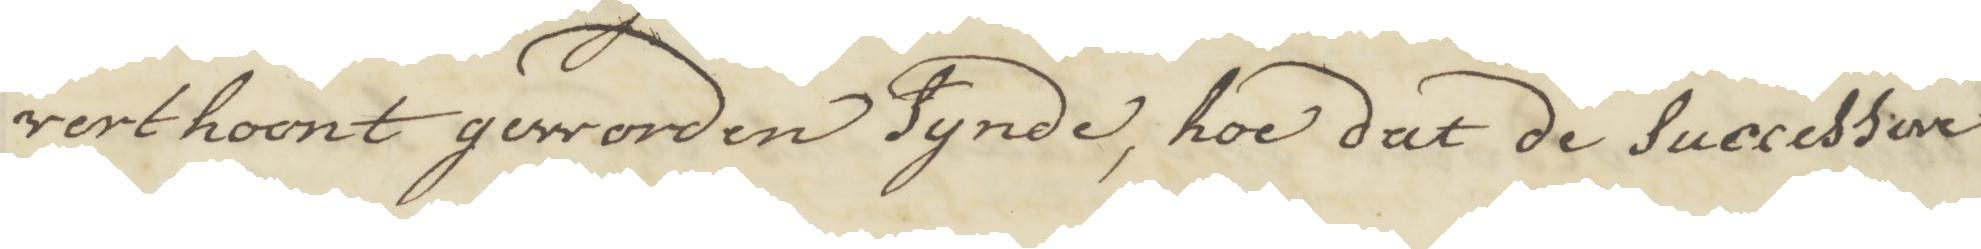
verthoont geworden synde, hoe dat de successive
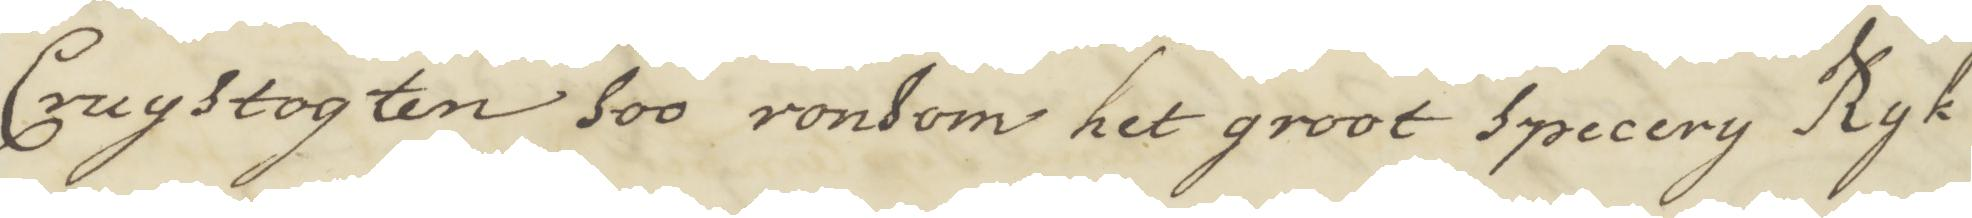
Cruystogten soo rondom het groot specery Ryk
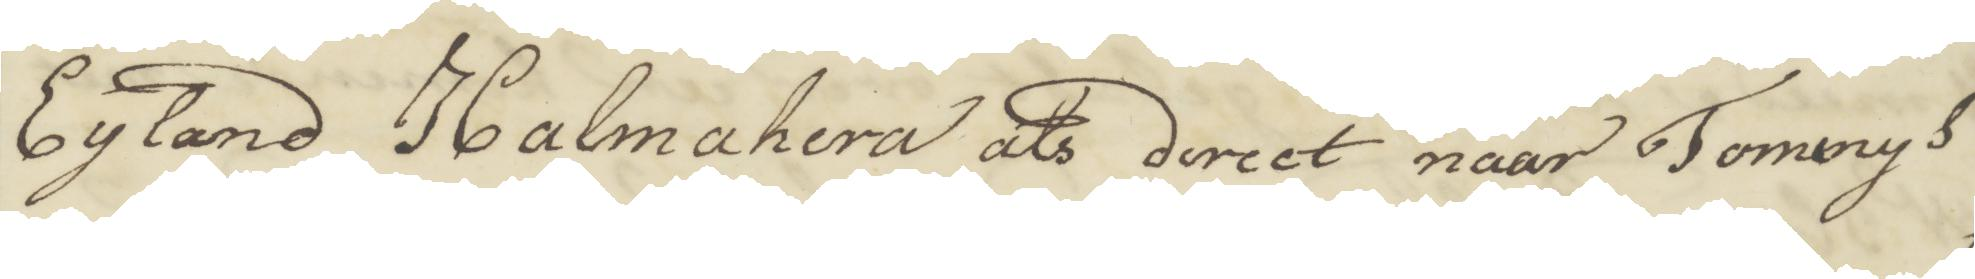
Eyland Halmahera als direct naar Tominys
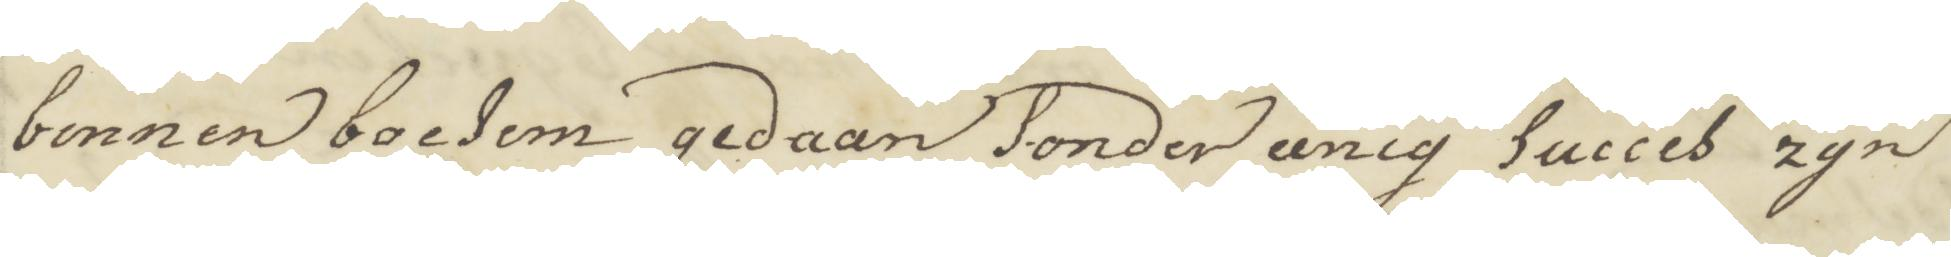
binnen boesem gedaan sonder eenig succes zyn
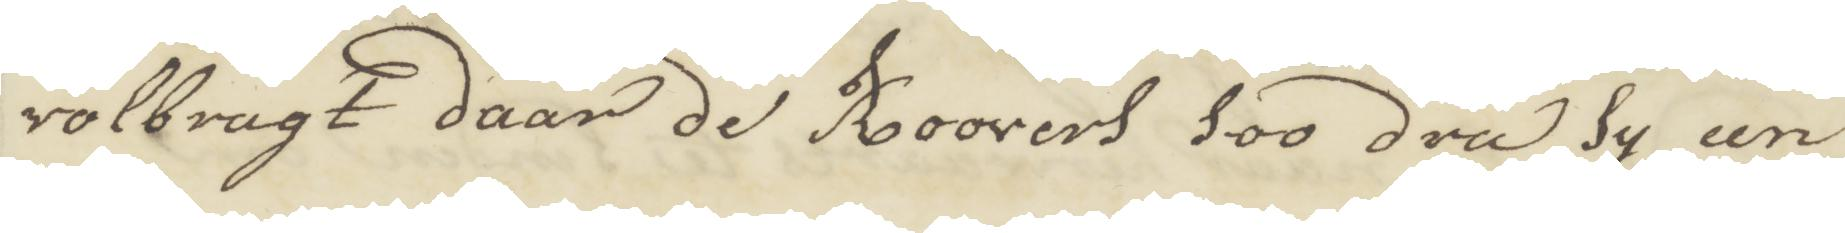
volbragt daar de Roovers soo dra sy een
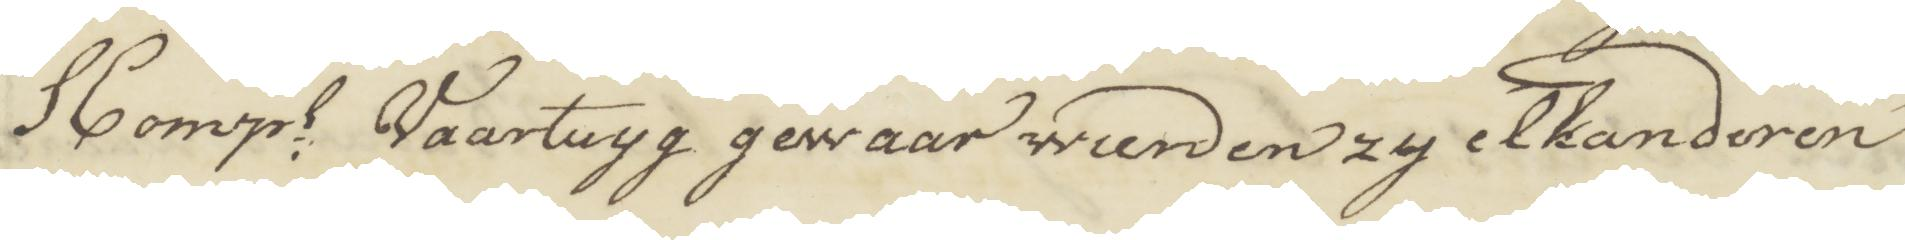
SComp:s Vaartuyg gewaar wierden zy elkanderen
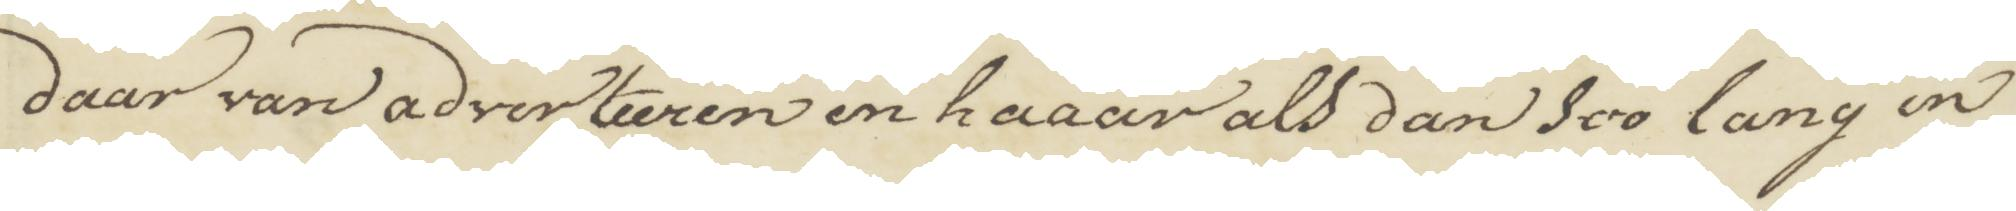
daar van adverteeren en haaar als dan soo lang in
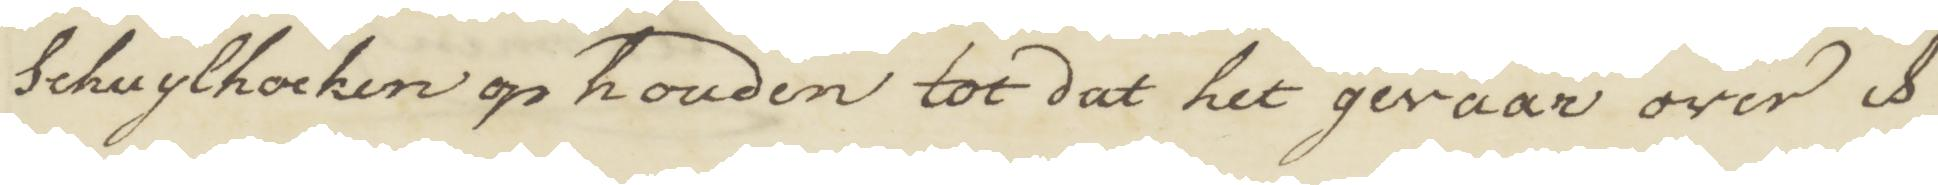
schuylhoeken op houden tot dat het gevaar over is
